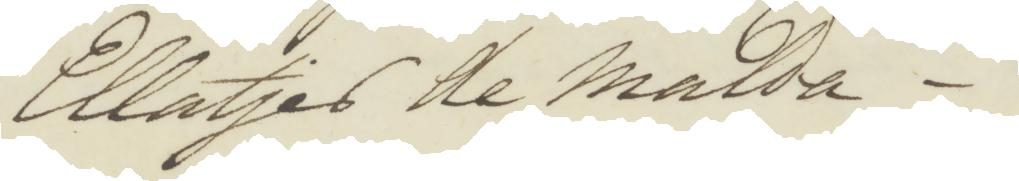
Ellatjes de malda - - - - - - - „ = „ 50
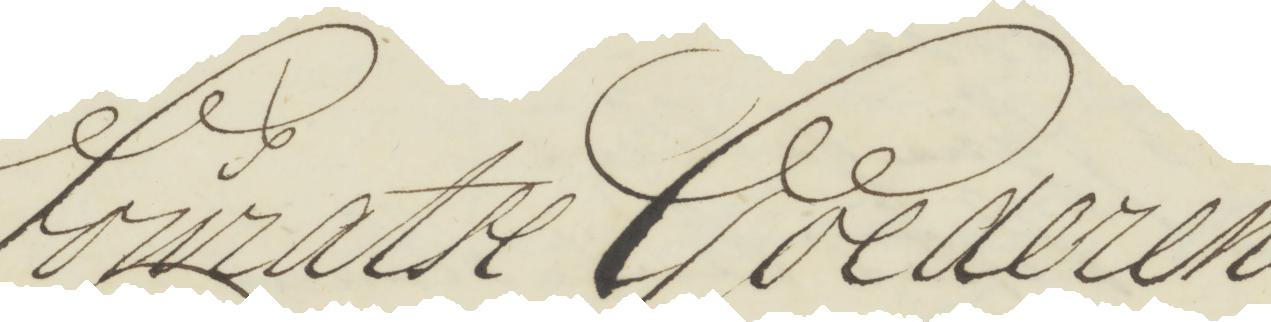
Sourate Goederen
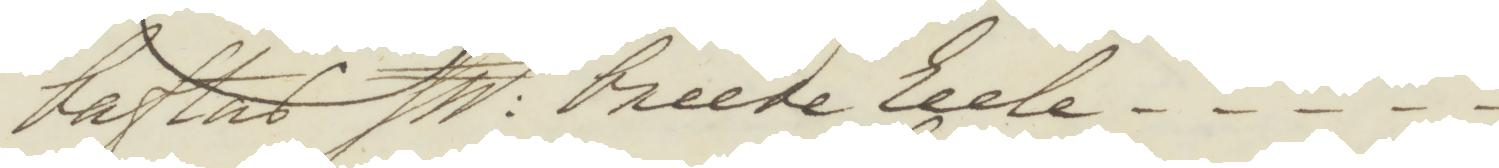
baftas sw: breede heele - - - - - „ 46 p:s
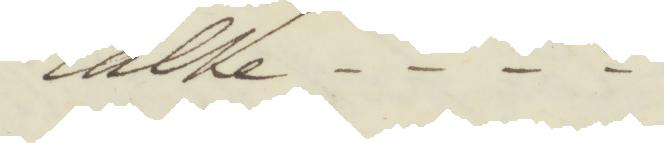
„ „ halve - - - - - „ 53 „ 59
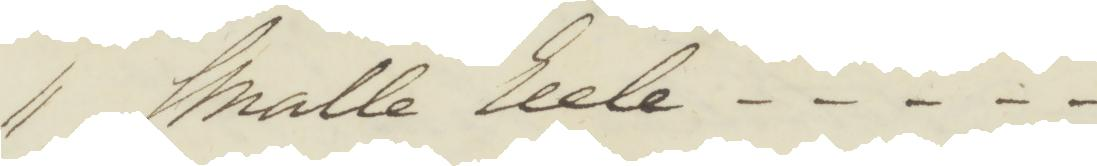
„ „ smalle heele - - - - - „ 36 „ 40
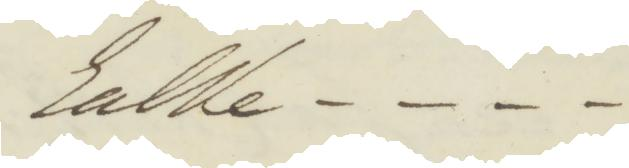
„ „ halve - - - - - „ 48 „ —
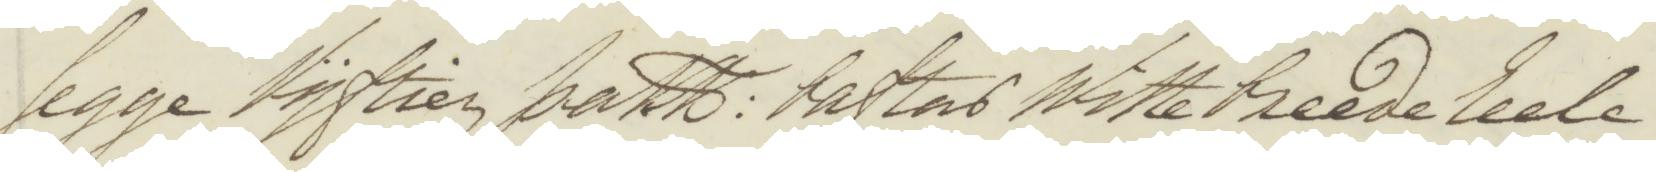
Segge vijftien pakk: baftas witte breede heele „ 25 „ —
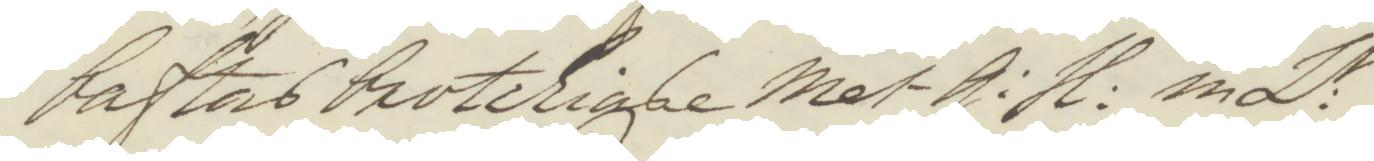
baftas brotchiase met G: H: in T:t „ 4 „ —
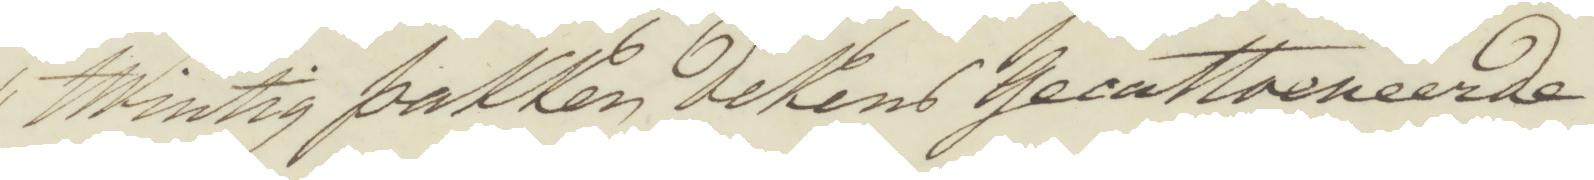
„ twintig pakken dekens gecattoeneerde „ 20 „ —
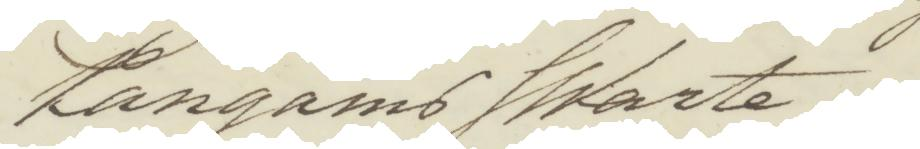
tangams
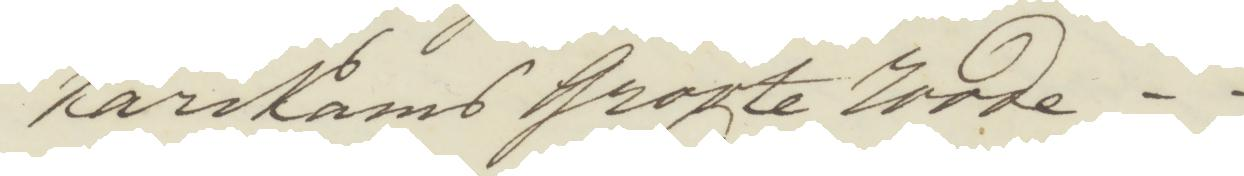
karikams Groote roode - - - - - „ 3 „ 16
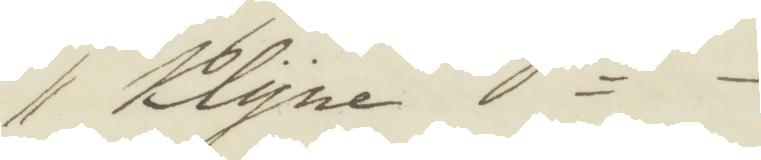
„ Klijne d=o - - - - - - - „ 3 „ 210
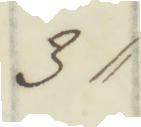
3 „ =
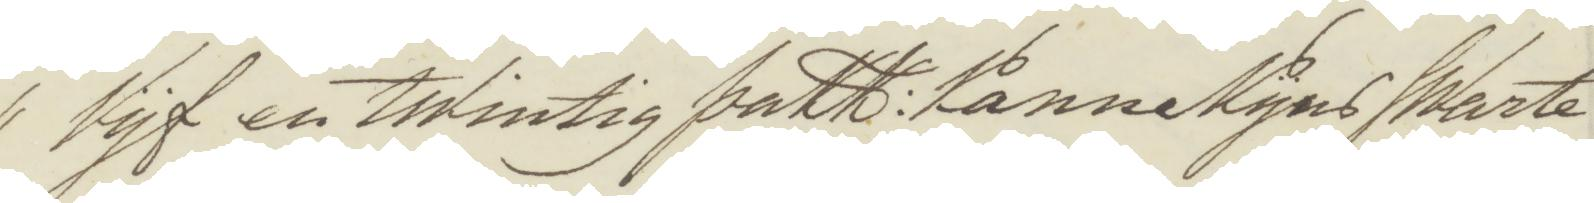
„ vijf en twintig pakk: Kannekijns swarte „ 3 „ =
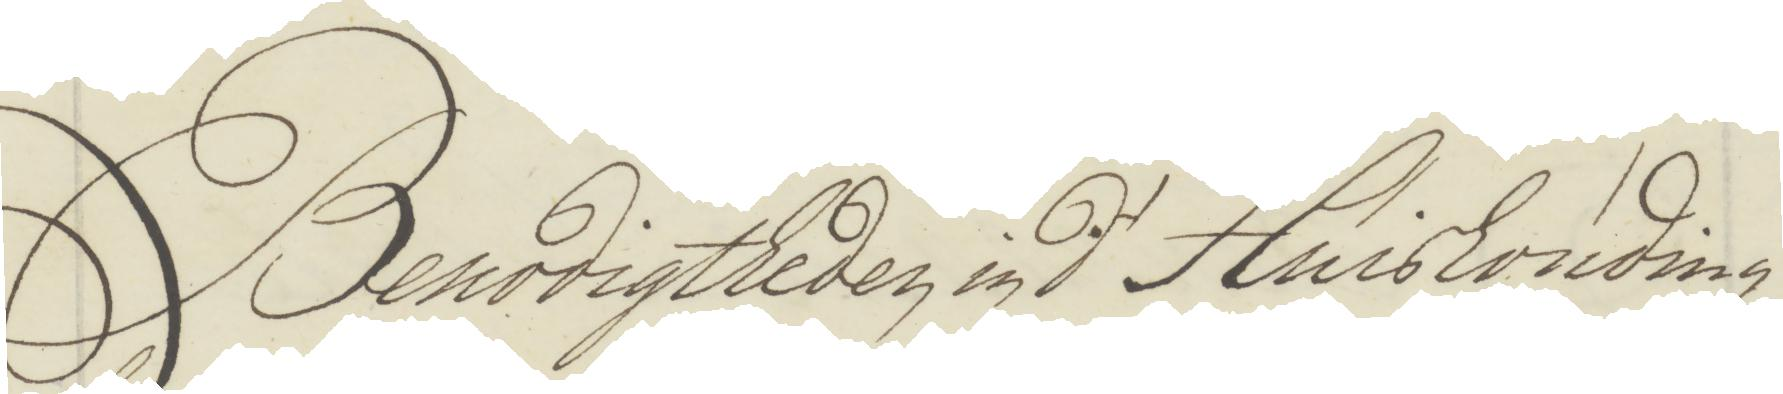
Benodigtheden in d' Huishouding
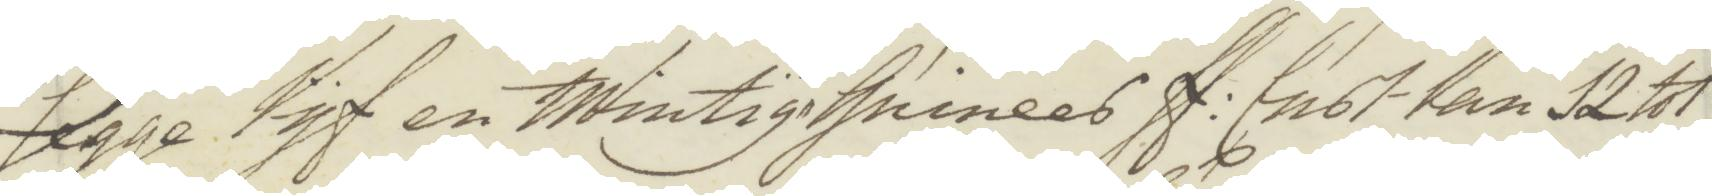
Segge Vijf en twintig Guinees ff: Cust Van 12 tot
